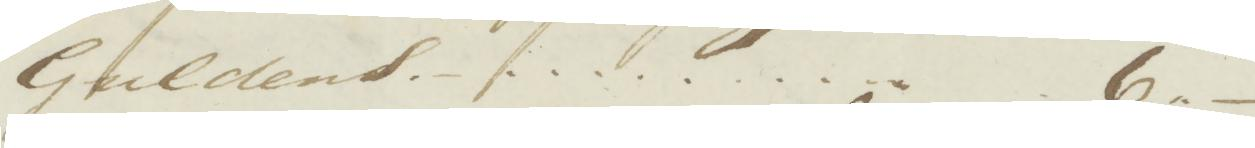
Guldens. 6 „-
